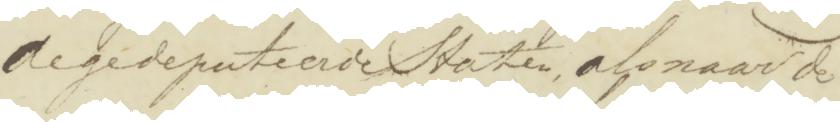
de gedeputeerde Staten, als naar de
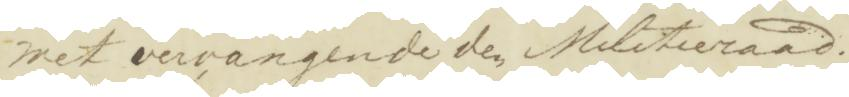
wet vervangende den Militieraad.
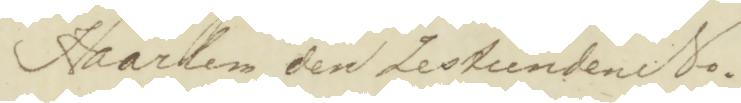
Haarlem den Zestienden No„
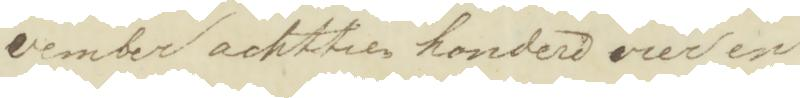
vember achttien honderd vier en
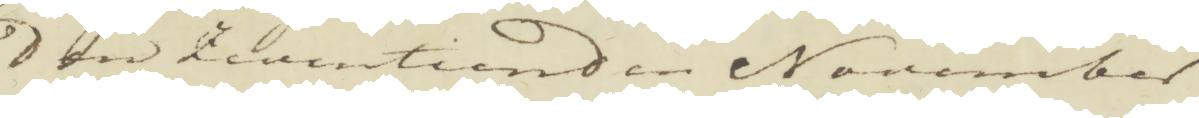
den Zeventienden November
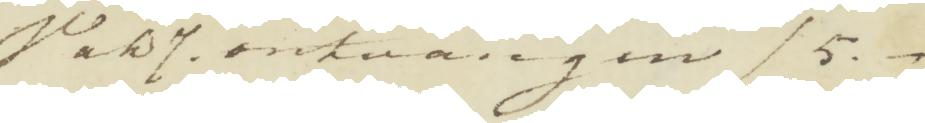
Vak 7. ontvangen ƒ5.-
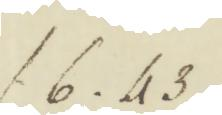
ƒ6.43
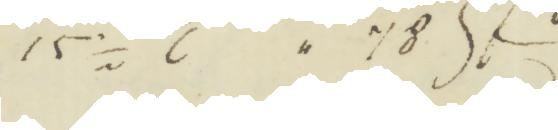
15½ /c=t „ 78
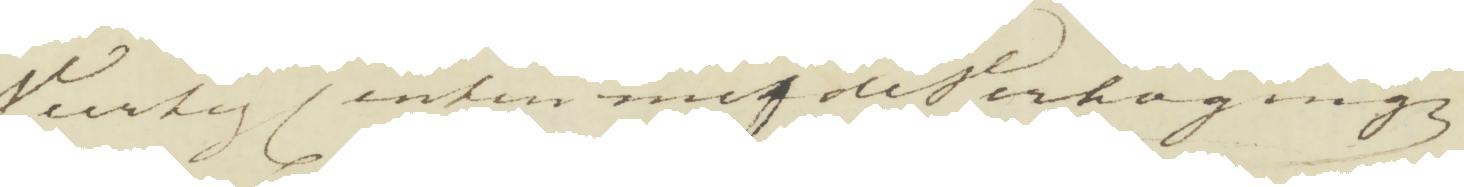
Veertig Centen met de Verhogingen
